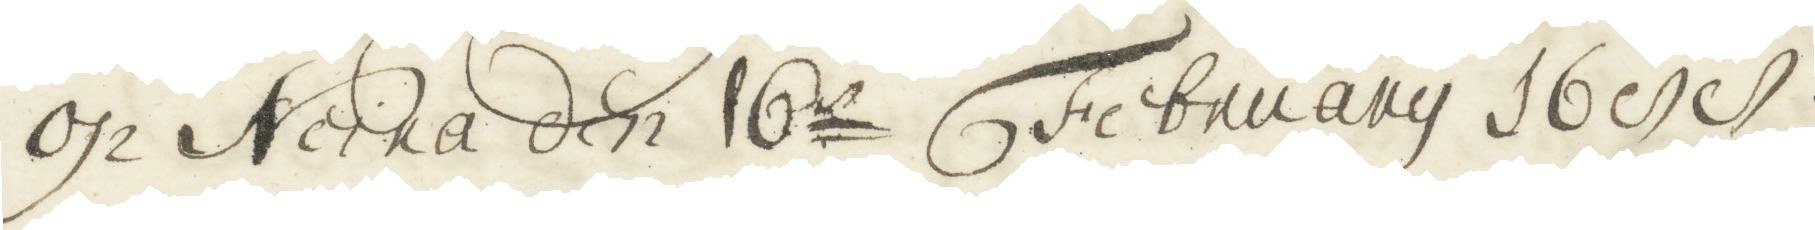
op Neira den 16=e Februarij 1688
